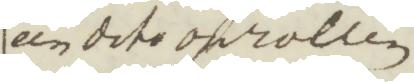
een dito oprollen
